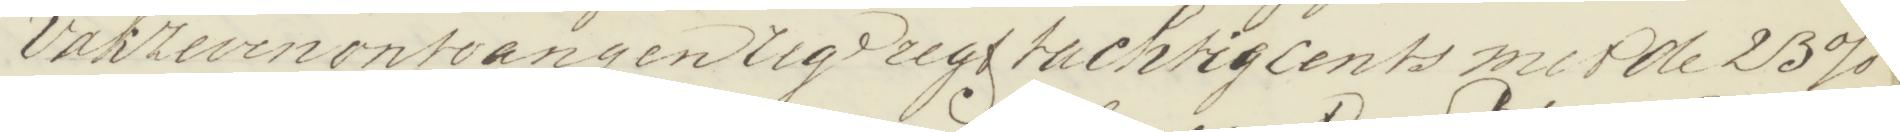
Vakzeven ontvangen Rege regt tachtig cents met de 23 %
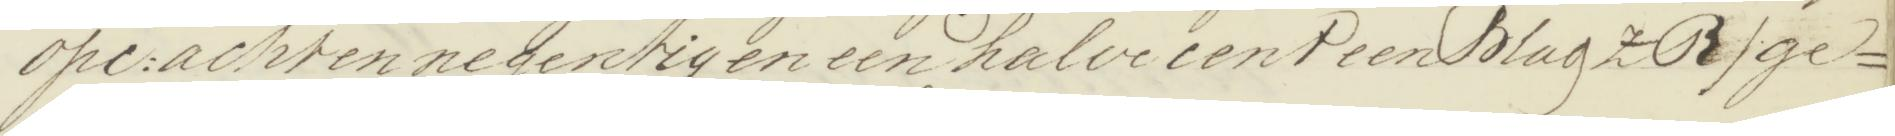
opc: acht en negentig en een halve cent een Blad Z R/ge=
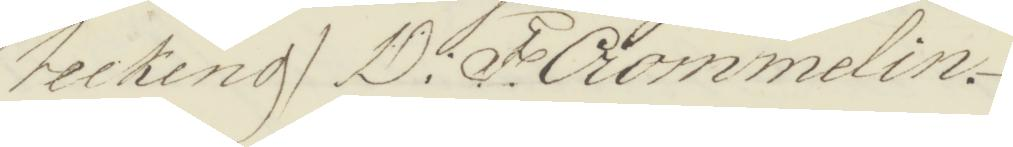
teekend/ D: F. Crommelin.
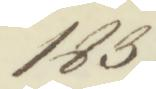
1837,
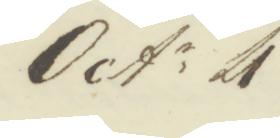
Oct:r 4
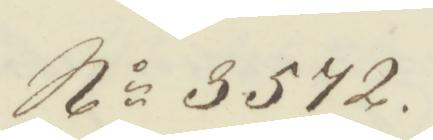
N=o 3572.
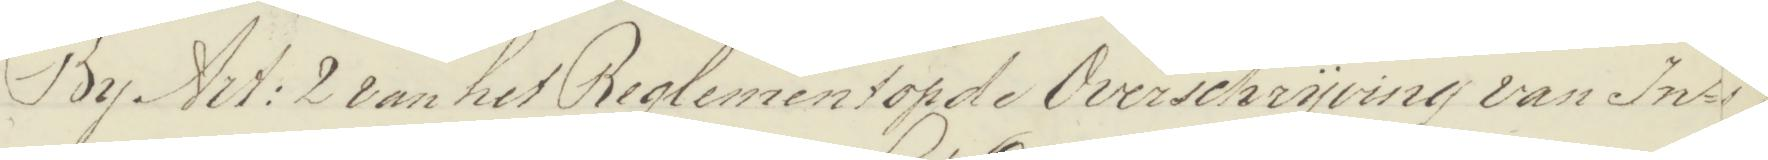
Bj Art: 2 van het Reglement op de Overschrijving van In=
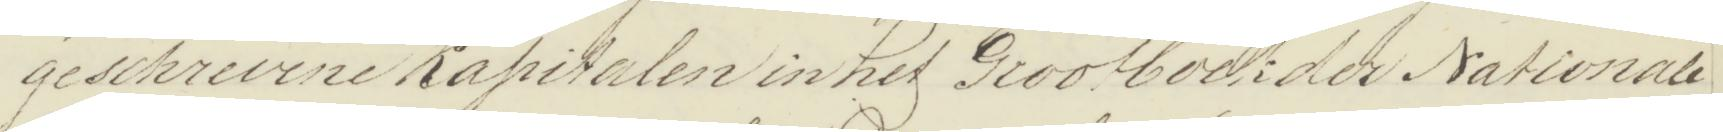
geschrevene Kapitalen in het Grootboek der Nationale
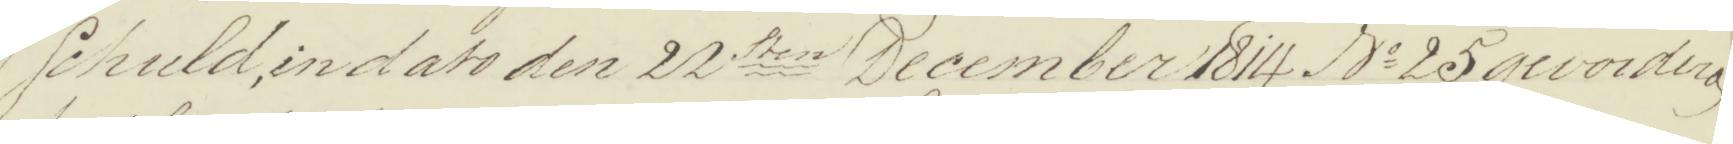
Schuld, in dato den 22=sten December 1814 N=o 25 gevorderd
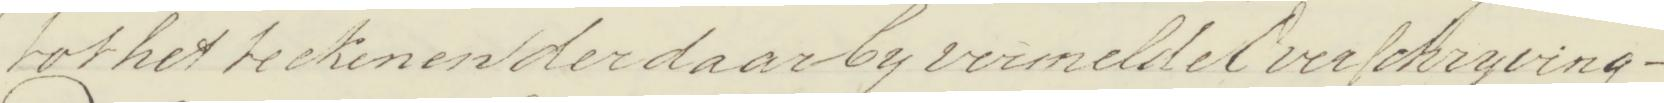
tot het teekenen der daarby vermelde Overschryving-
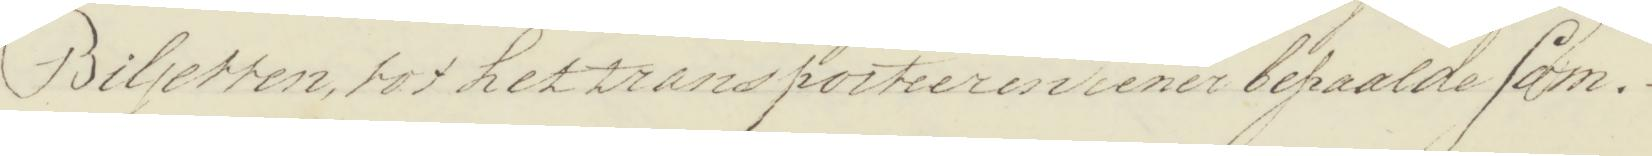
Biljetten, tot het transporteeren eener bepaalde Som.
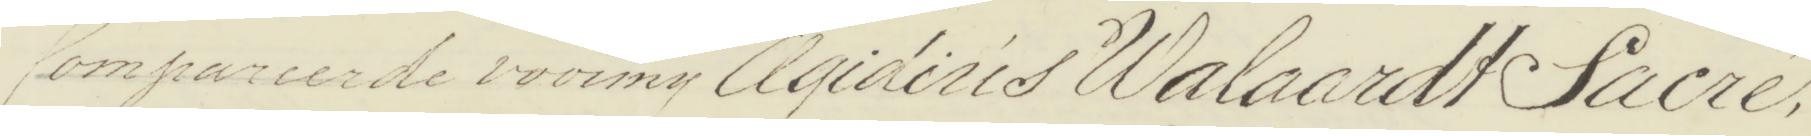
Compareerde voormy AEgidius Walaardt Sacré,
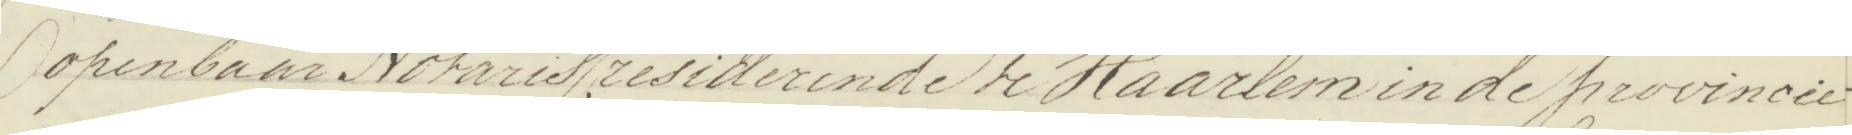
openbaar Notaris, residerende te Haarlem in de provincie
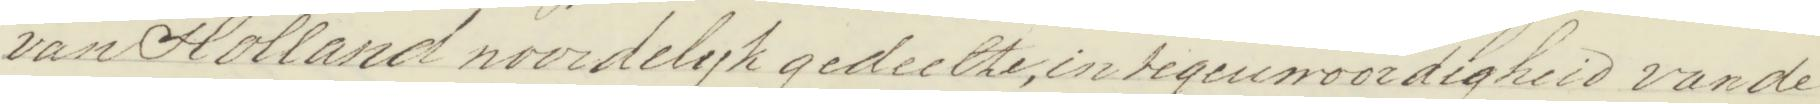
van Holland noordelyk gedeelte, in tegenwoordigheid van de
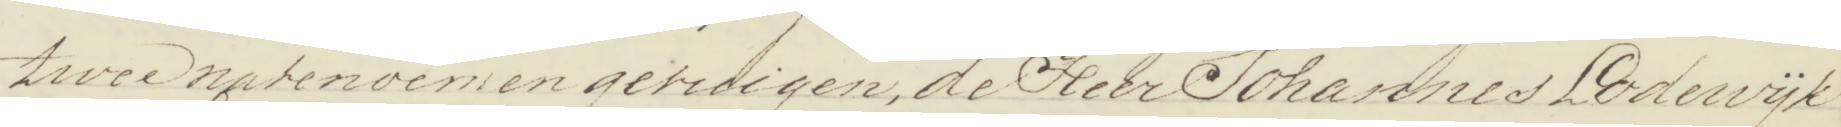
twee natenoemen getuigen, de Heer Iohannes Lodewijk
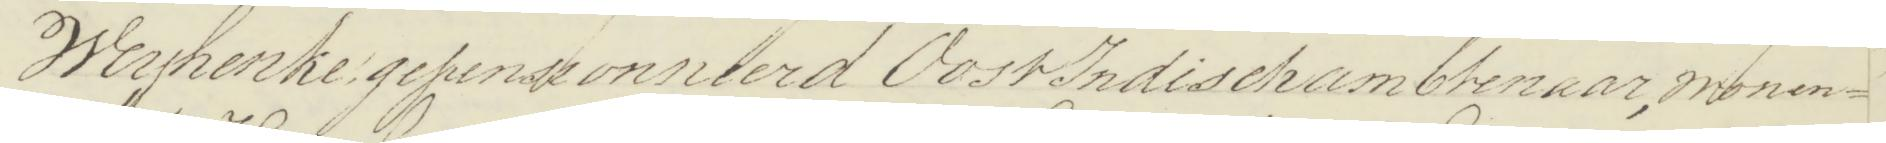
Weyhenke, gepensionneerd Oost Indisch ambtenaar, wonen=
